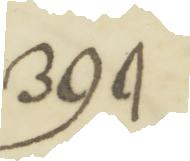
394
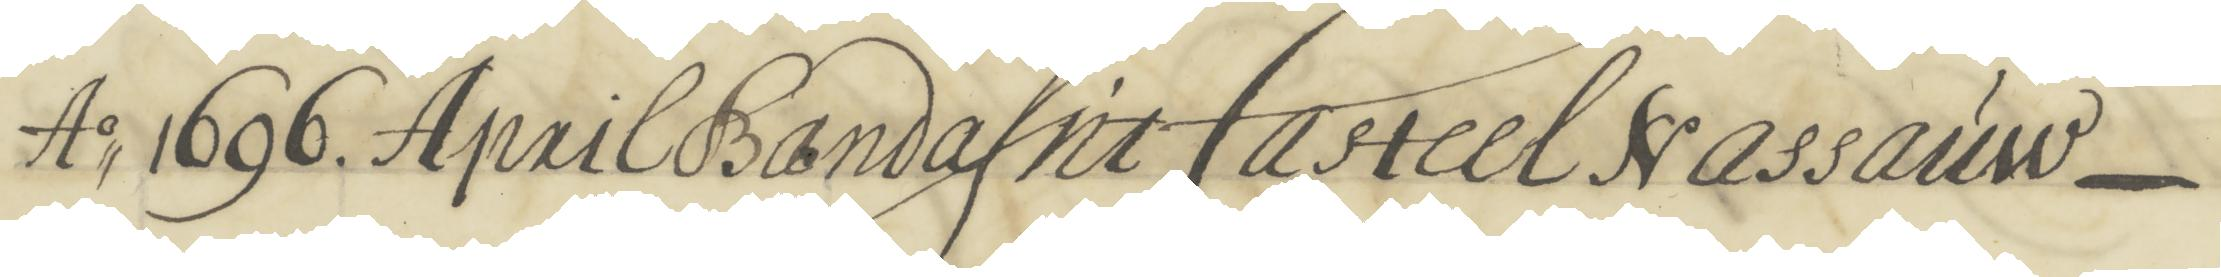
A„o 1696. April Banda In't Casteel Nassauw —
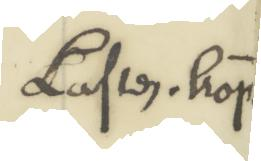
Lasten. kop
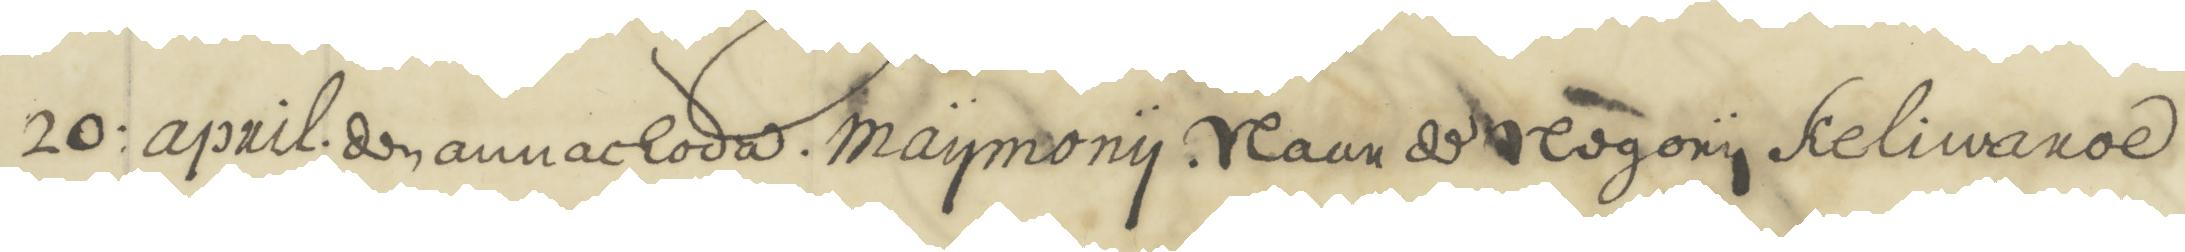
20: april. den annachoda. maijmonij. Naar de Negorij keliwaroe
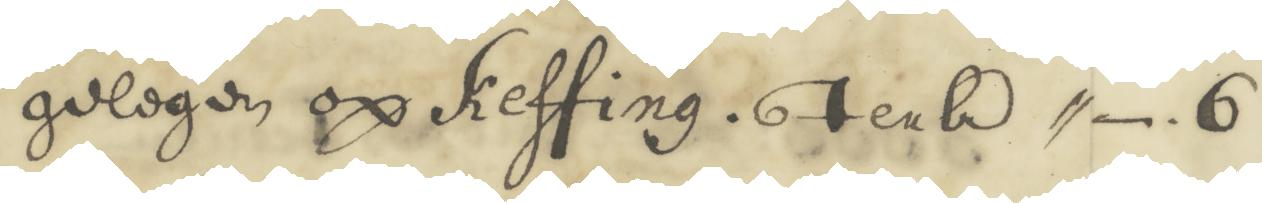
gelegen op keffing. sterk „ —. 6
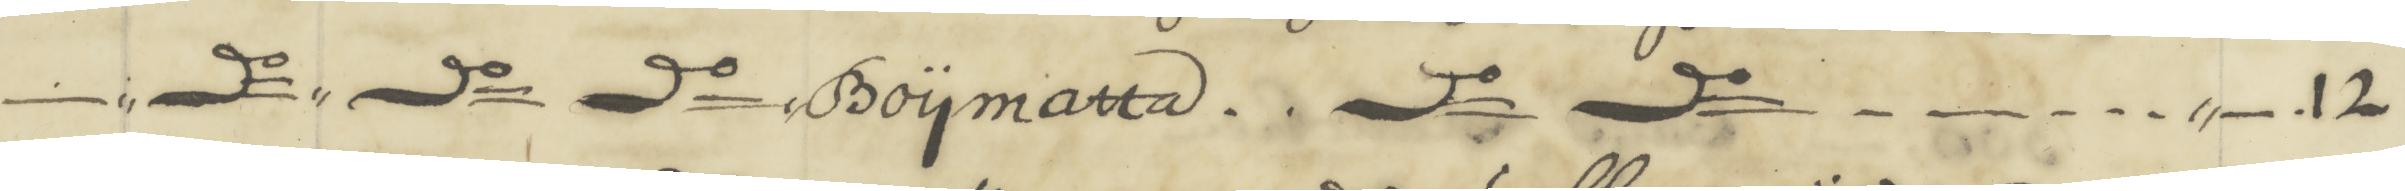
—„ _=o „ _=o _=o „ Boijmatta . . _=o _=o - - - - - -„ —. 12
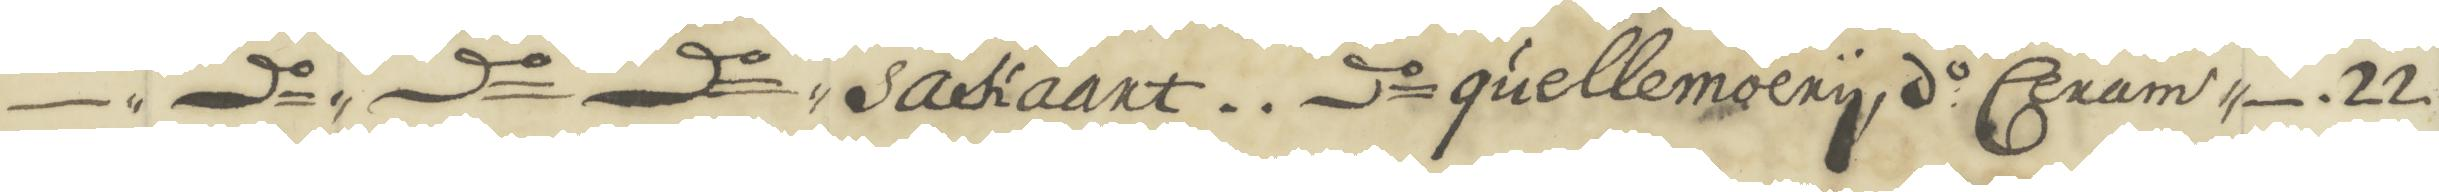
—„ _=o „ _=o _=o „ sakaart . . _=o quellemoerij, d:o Ceram „ —. 22.
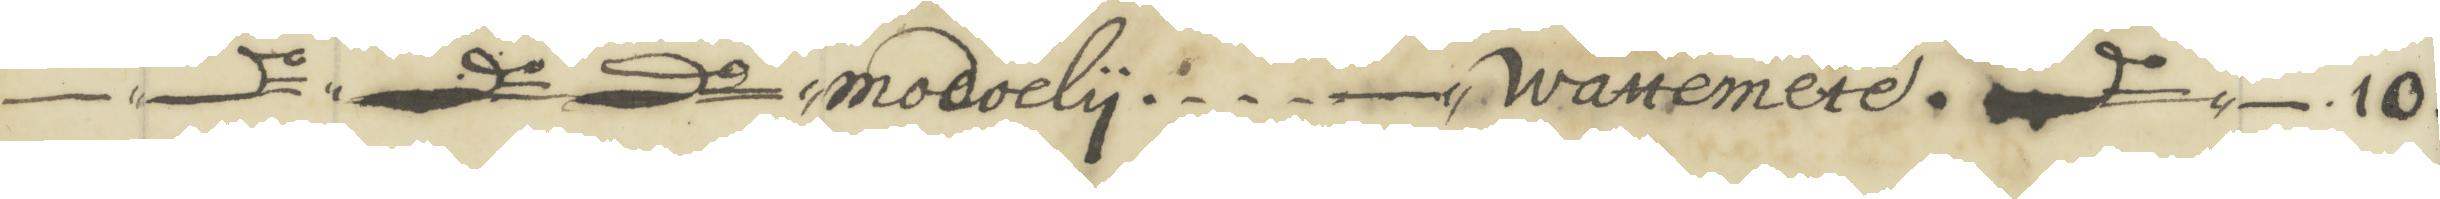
—„ _=o „ _=o _=o „ modoelij . - - - —„ wattemete. _=o „ —. 10.
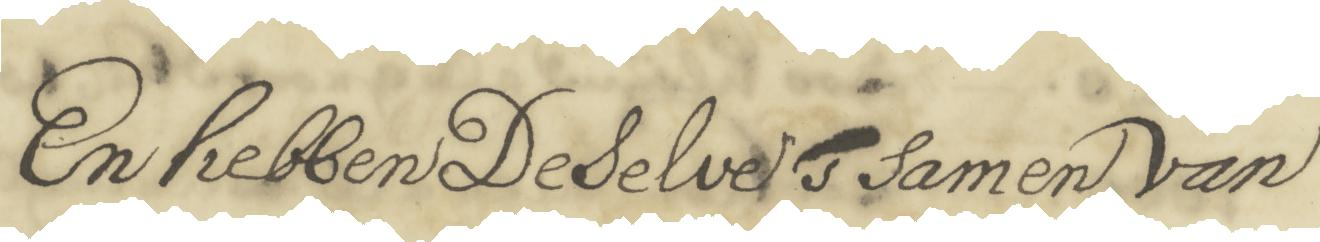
En hebben Deselve 'T samen van
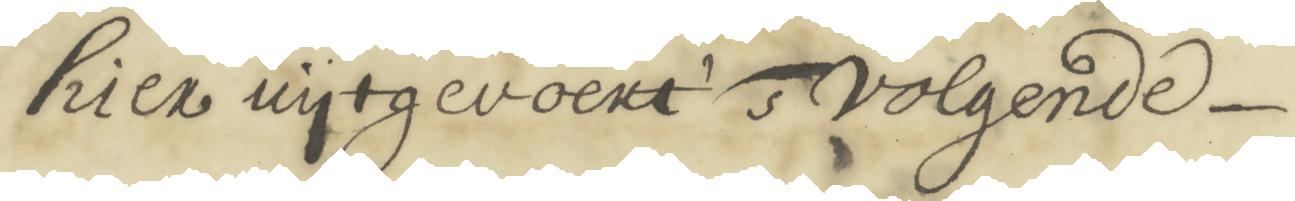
hier uijtgevoert 'T volgende —
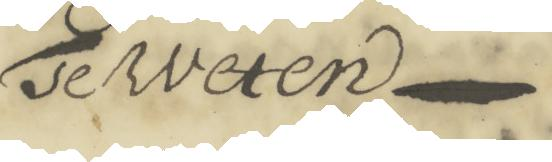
Te weten —
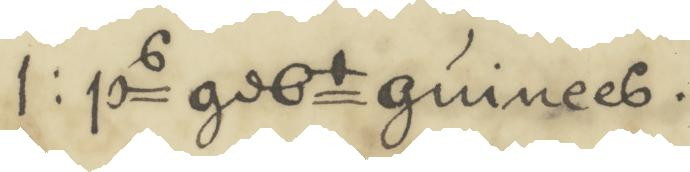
1: p=s geb=t guinees.
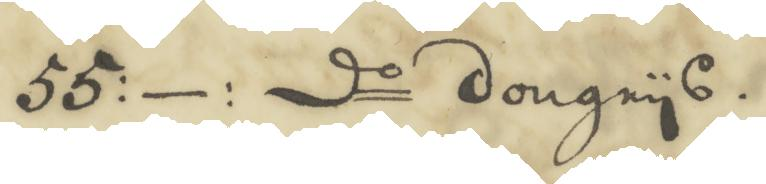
55: —: d=o dongrijs.
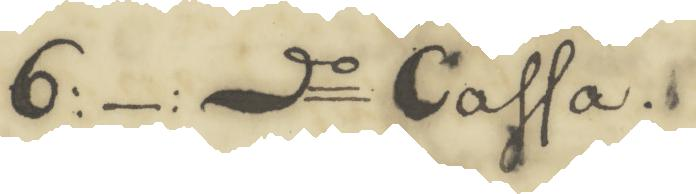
6: —: d=o Cassa.
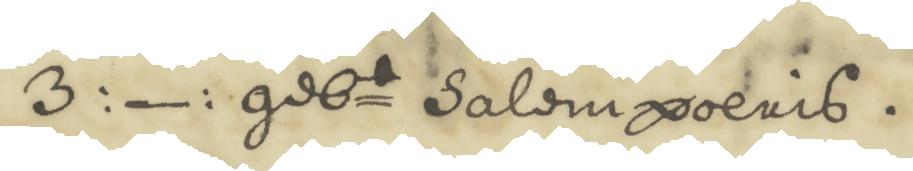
3: —: geb=t salempoeris.
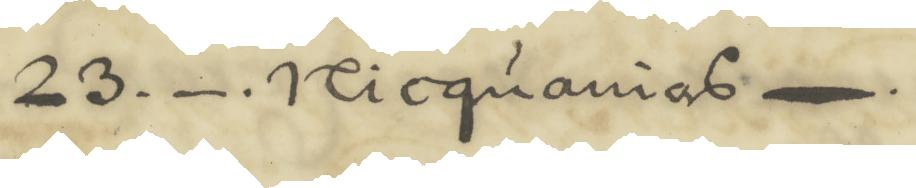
23. —. Nicquanias —.
